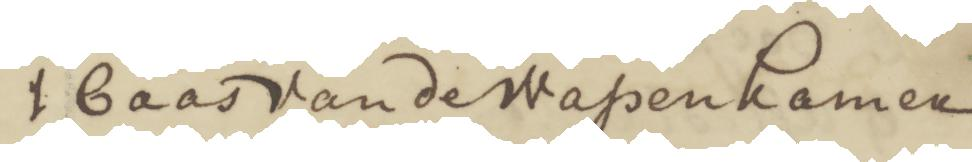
1 baas van de wapenkamer
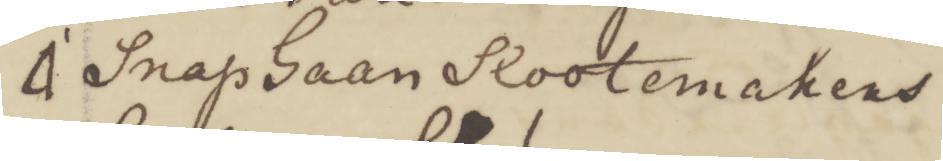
4' snaphaan slootemakers
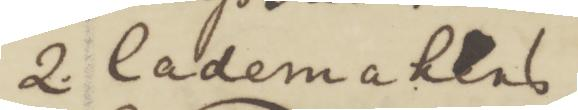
2. lademakers
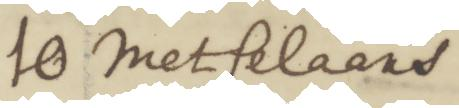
10 metselaars
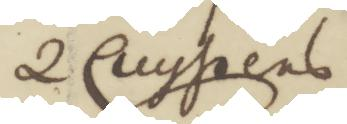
2 cuijpers
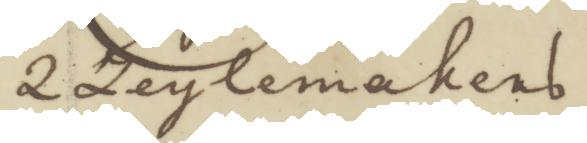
2 zeijlemakers
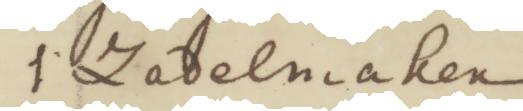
1' Zadelmaker
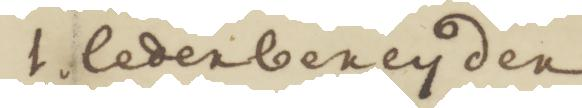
1. lederbereyder
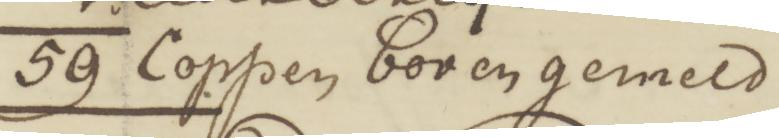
59 Coppen bovengemeld
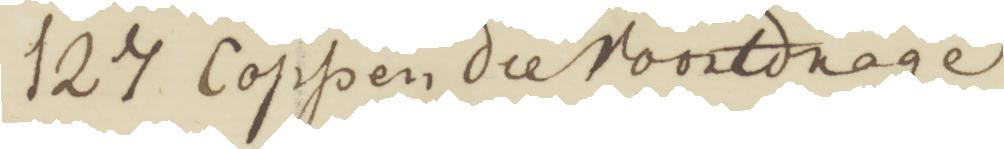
127 Coppen die voortdrage
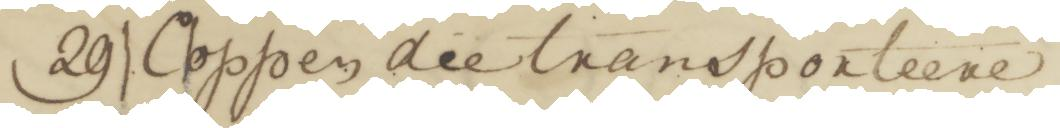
29 Coppen die transporteere
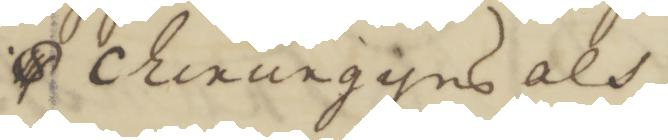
8 chirurgijn als
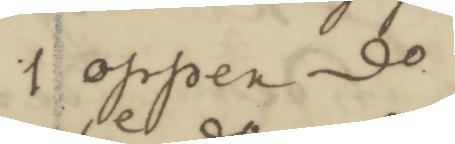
1 opper _o
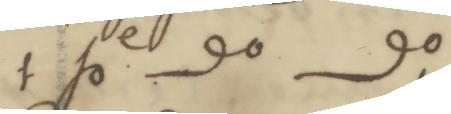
1 pl _o _o
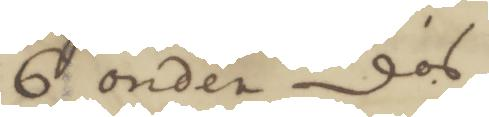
6 onder _os
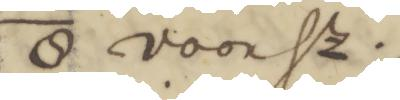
8 voorsz.
